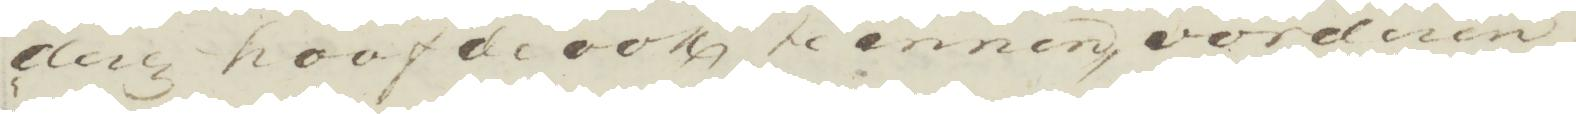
„dere hoofde ook te konnen, vorderen,
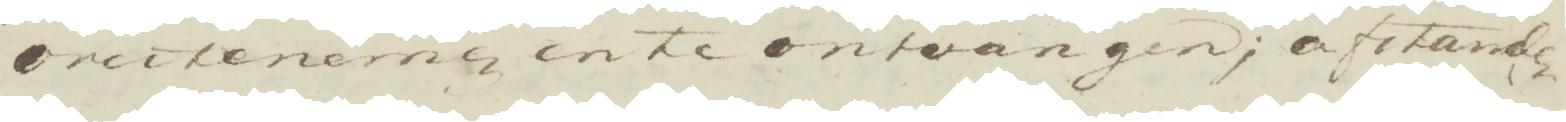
over te nemen en te ontvangen; afstanden
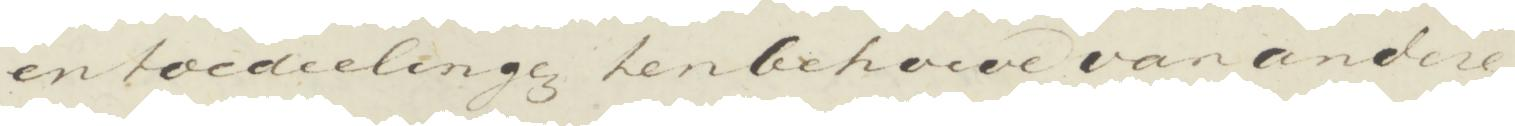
en toedeelingen ten behoeve van anderen
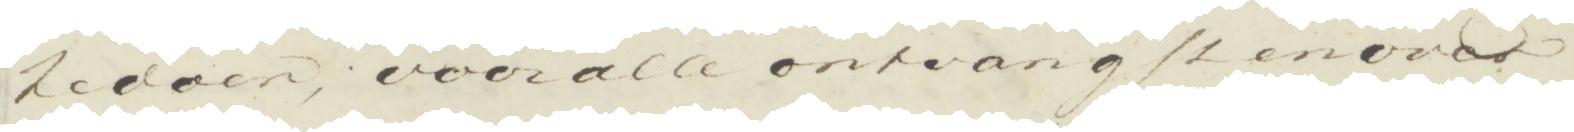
te doen, voor alle ontvangst en over
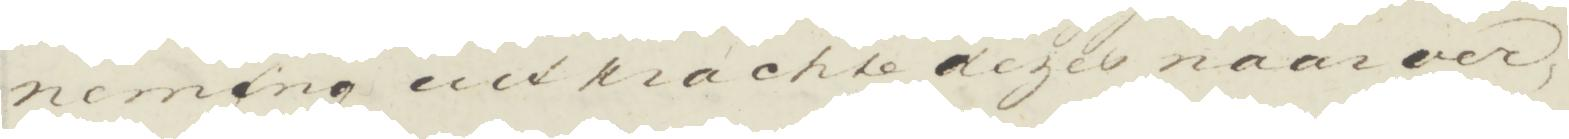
neming uit krachte dezes naar ver,
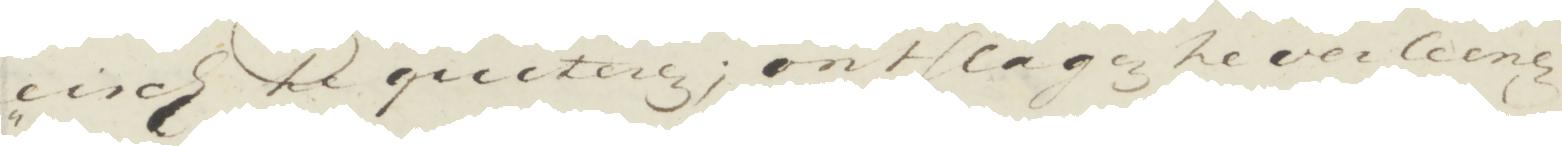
„eisch te quiteren; ontslagen te verleenen
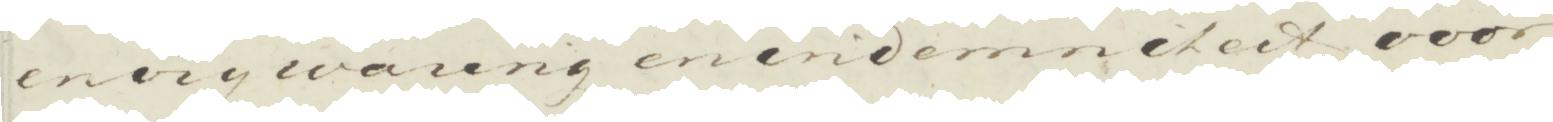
en vrywaring en indemniteit voor
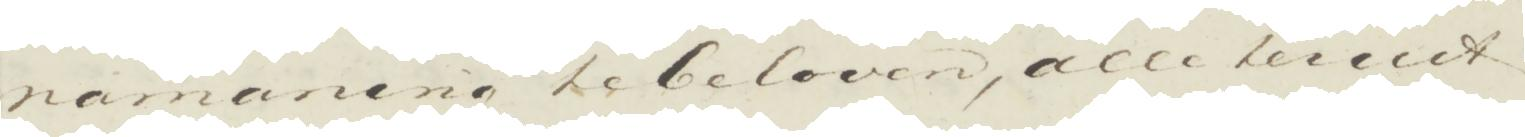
namaning te beloven, alle ter uit
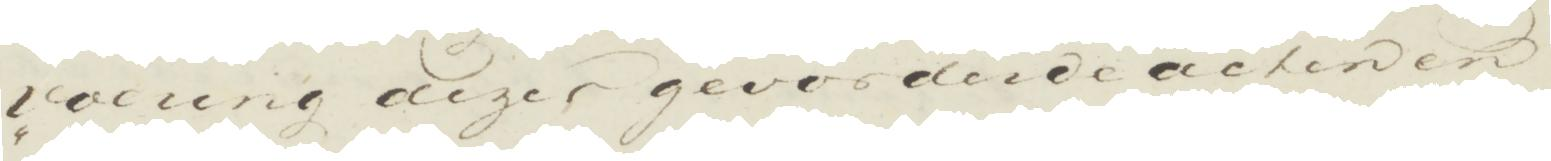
„voering dezer gevorderde acten en
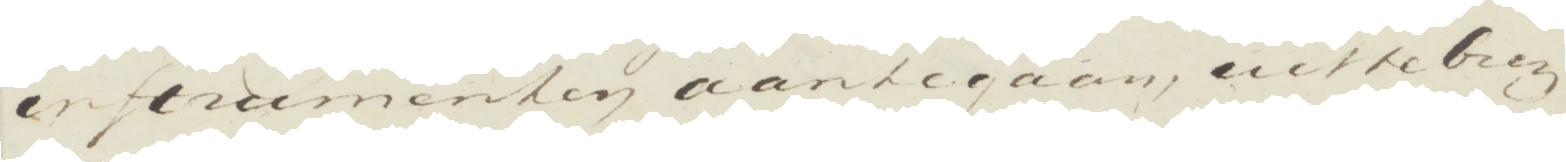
instrumenten aan te gaan, uit te bren
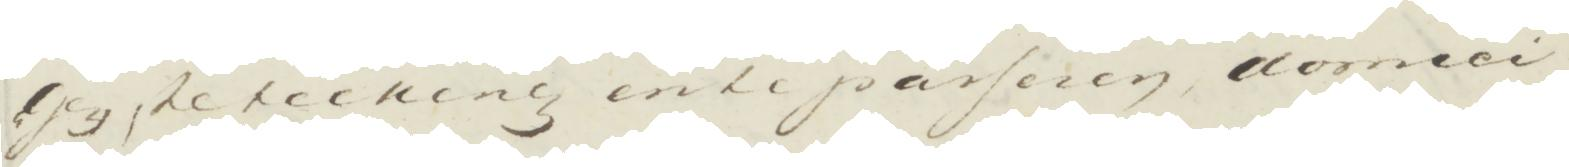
gen, te teekenen en te passeren, domici
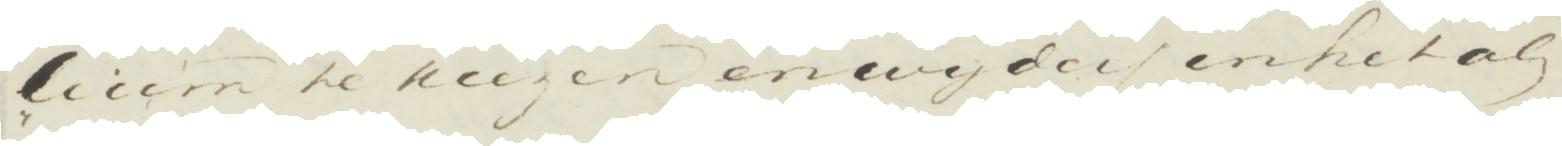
„lieern te kiezen en wyders en het al,
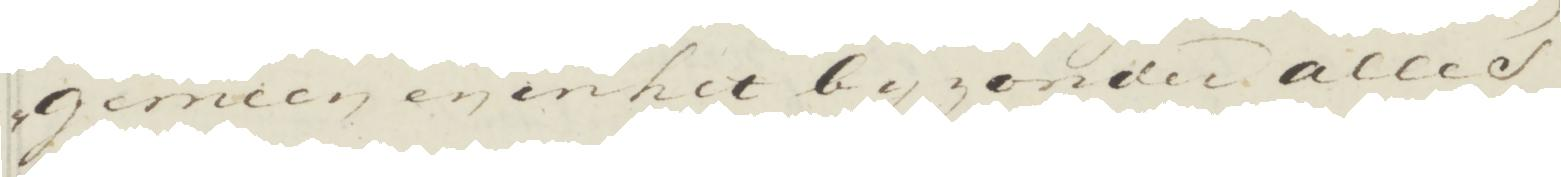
„gemeen en in het byzonder alles
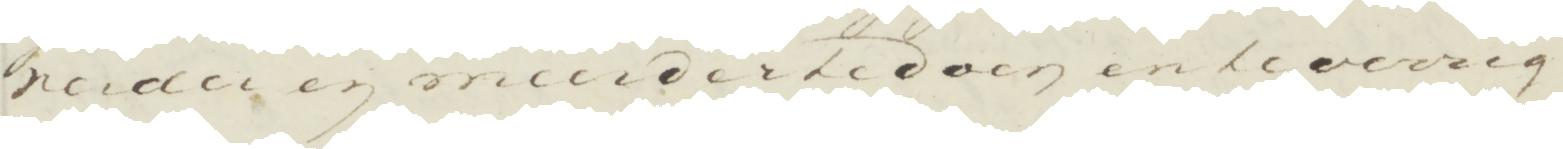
verder en meerder te doen en te verrig
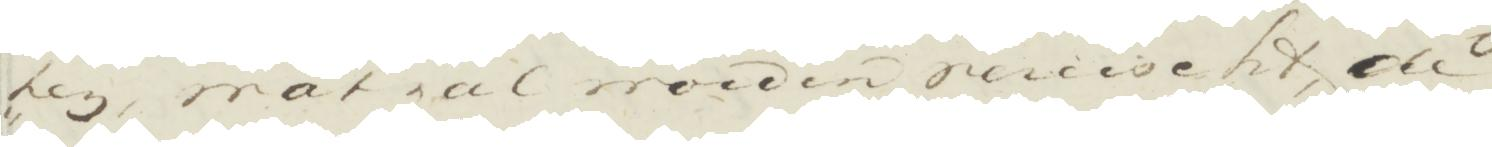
„ten, wat zal worden vereischt de
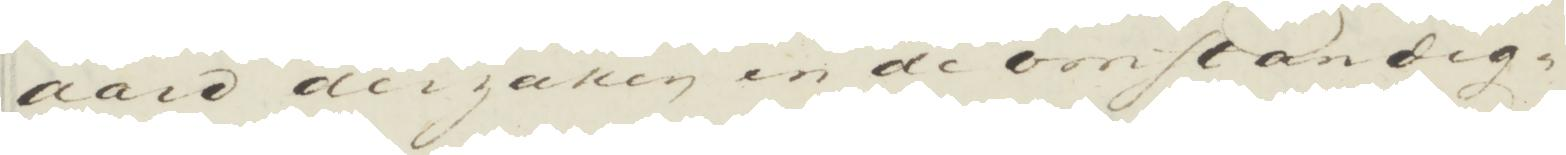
aard der zaken en de omstandig„
